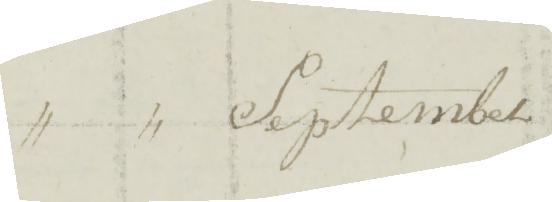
„ „ September
